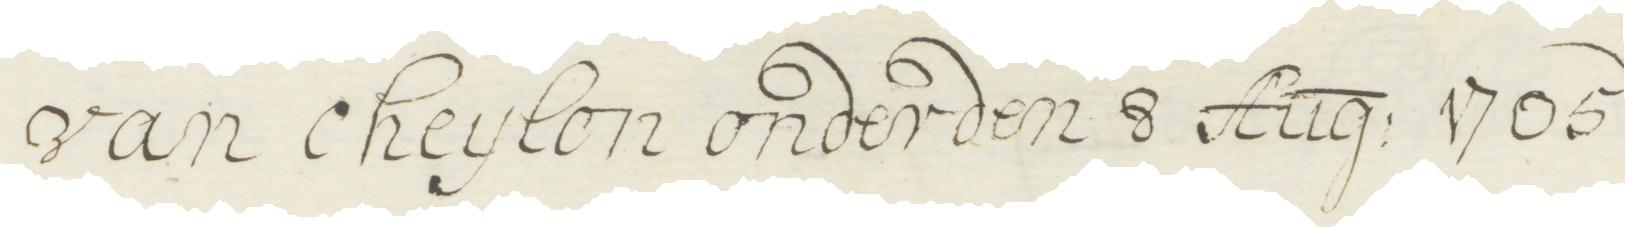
van Cheijlon onder den 8 Aug: 1705
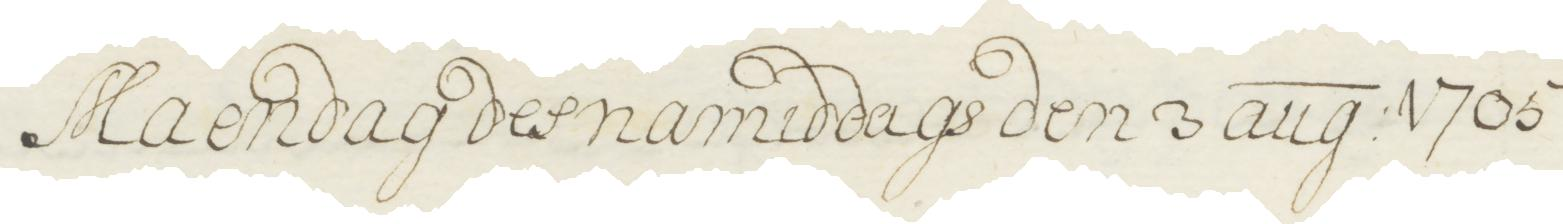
Maendag des namiddags den 3 aug: 1705
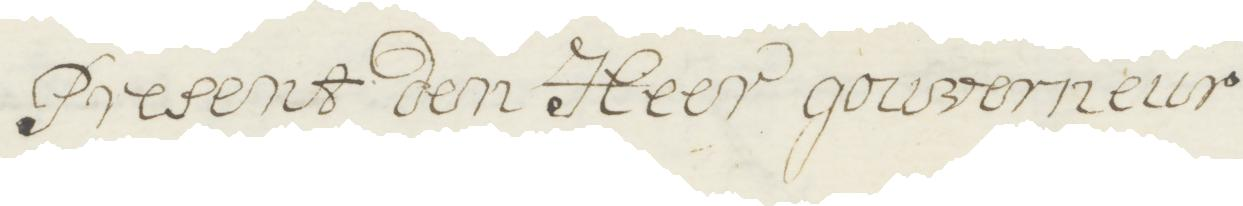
Present den Heer gouverneur
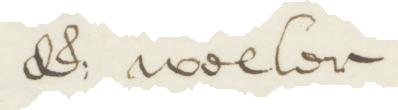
dE: welter
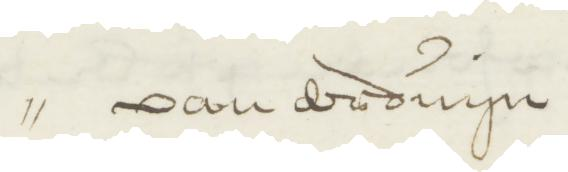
„ van der duijn
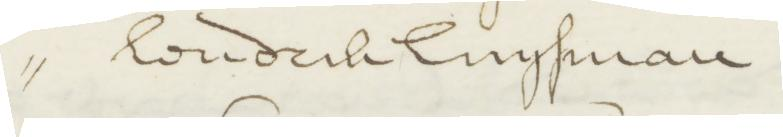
„ hendrik huijsman
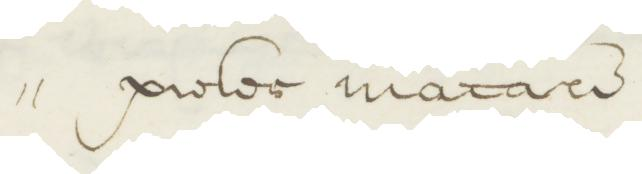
„ pieter macare
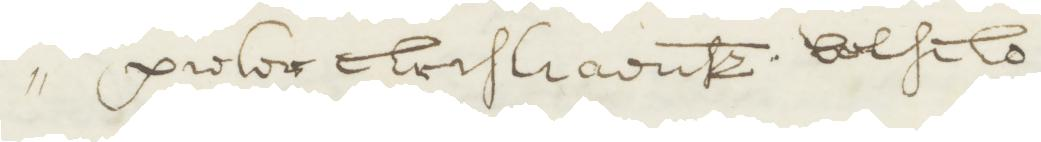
„ pieter christiaensz: bolscho
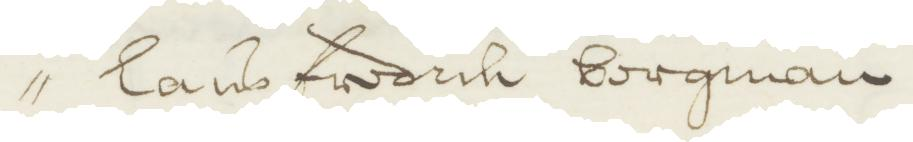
„ hans fredrik bergman
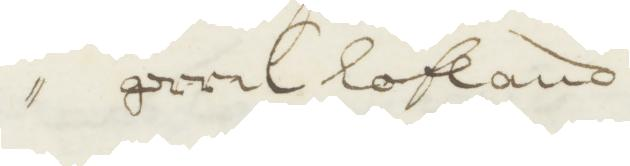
„ gerrit hofland
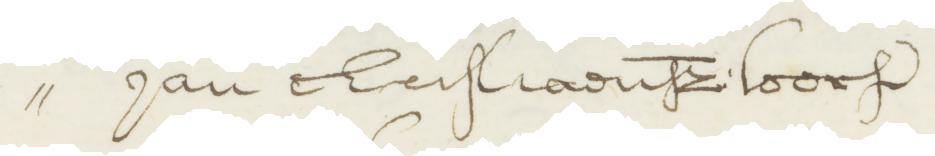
„ jan christiaensz: toorse
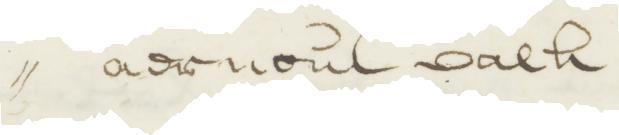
„ aernout valk
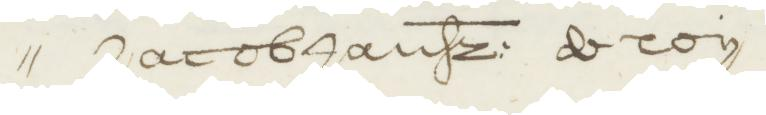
„ jacob jansz: de roij
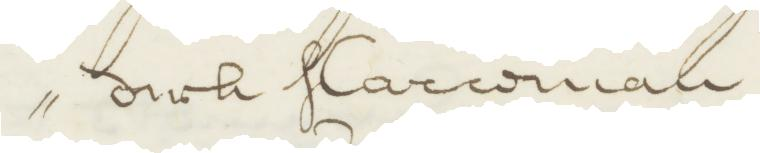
„ dirk starreman
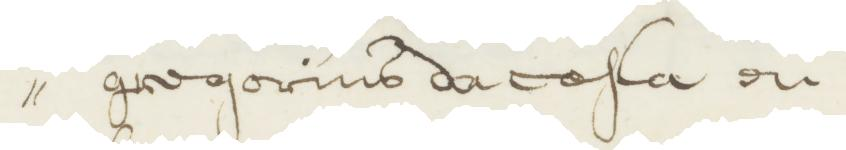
„ gregorius da costa en
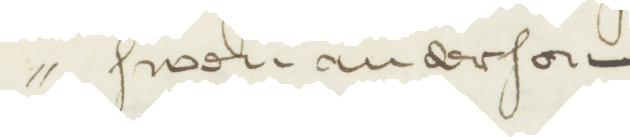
„ swen anderson
